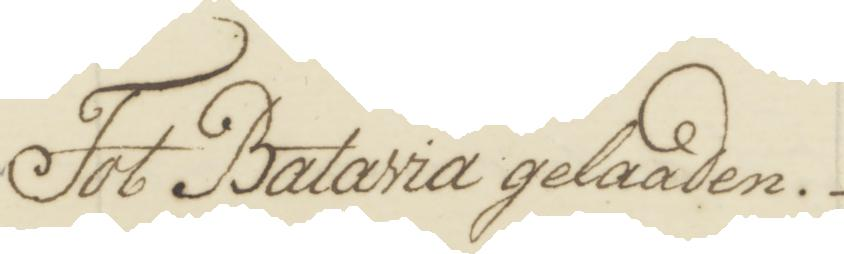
Tot Batavia gelaaden.
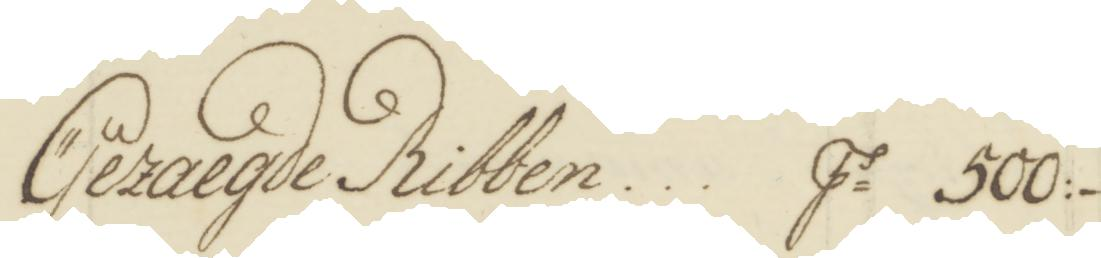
Gezaegde Ribben. . . p=s 500: -
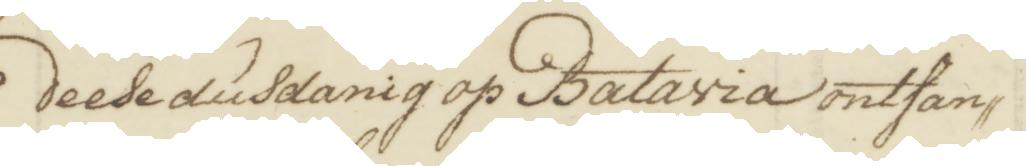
deese dusdanig op Batavia ontfan„
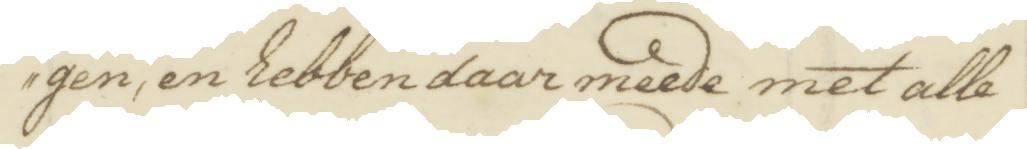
„gen, en hebben daar meede met alle
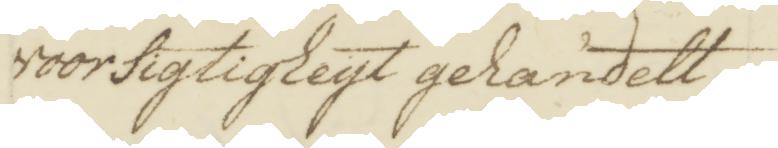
voor sigtigheijt gehandelt.
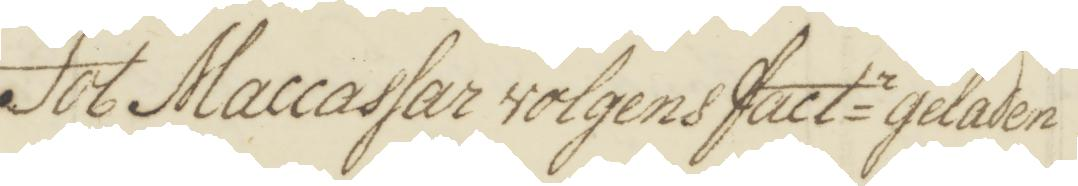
Tot Maccassar volgens fact=r geladen
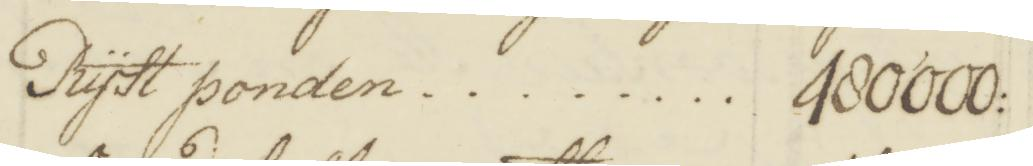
Rijst ponden . . . . . . . . 480000:
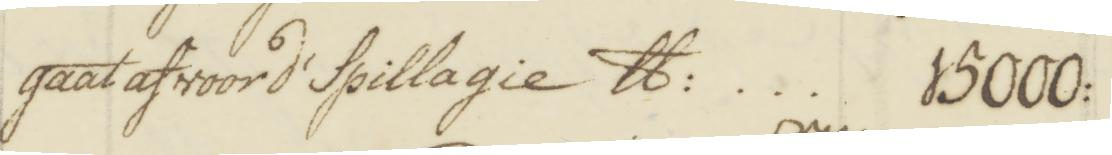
gaat af voor d’ spillagie lb:. . .15000:
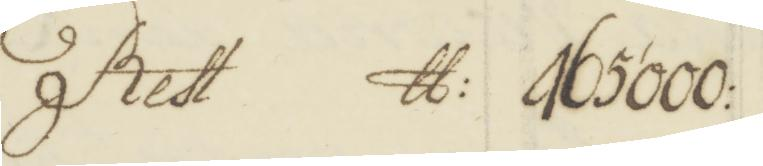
Rest lb: 465000:
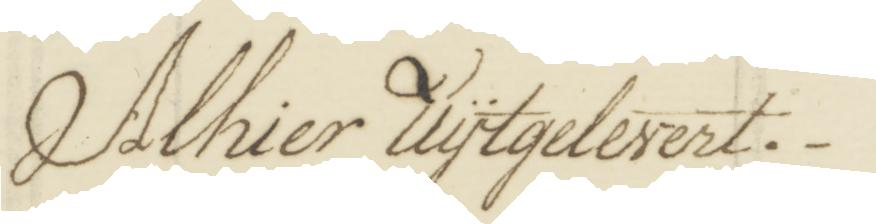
Alhier Uijtgelevert. —
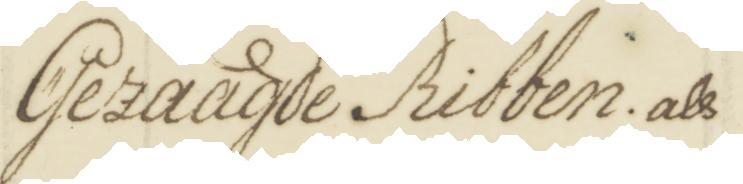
Gezaagde Ribben. als
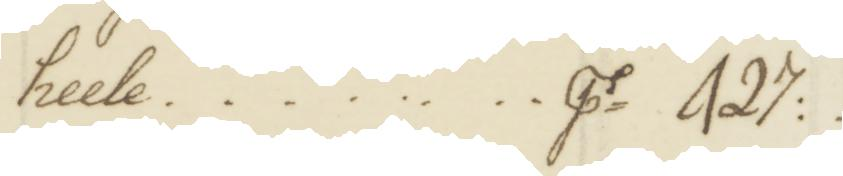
heele . . . . . . . . p=s 427: —
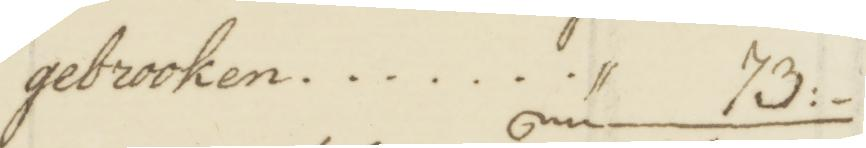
gebrooken . . . . . . . „ 73: —
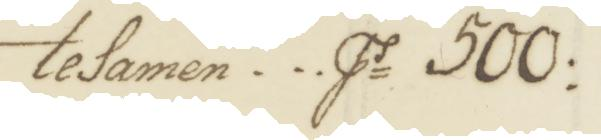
tesamen . . . p=s 500:
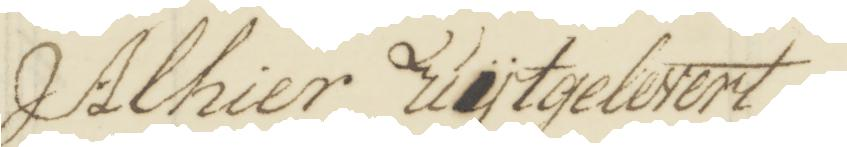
Alhier uijtgelevert. -
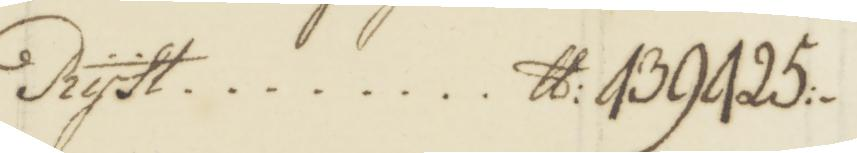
Rijst . . . . . . . . . lb: 439425: —
